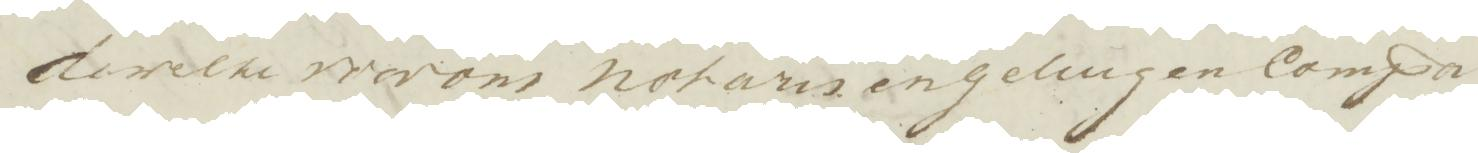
dewelke voor ons notaris en getuigen Compa
